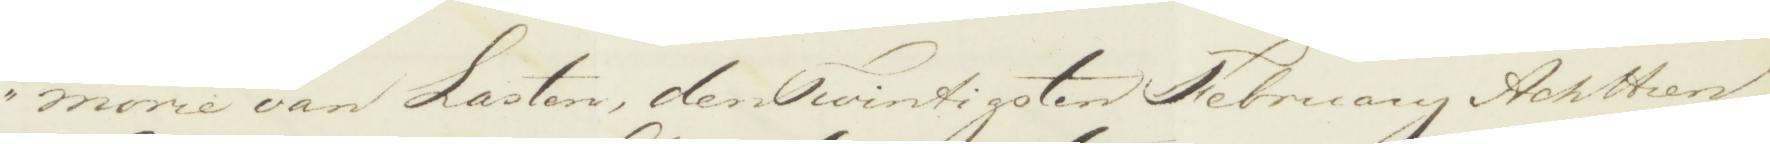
„morie van Lasten, den Twintigsten February Achttien
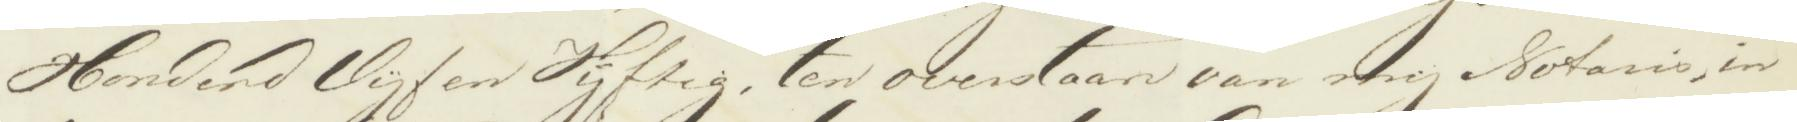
Honderd Vijf en Vijftig, ten overstaan van mij Notaris, in
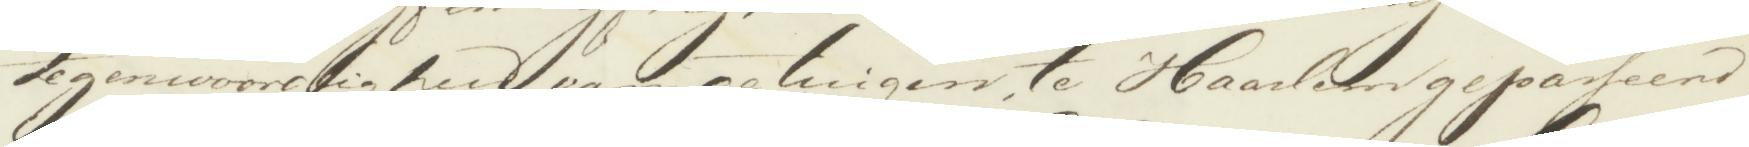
tegenwoordigheid van getuigen te Haarleem gepasseerd
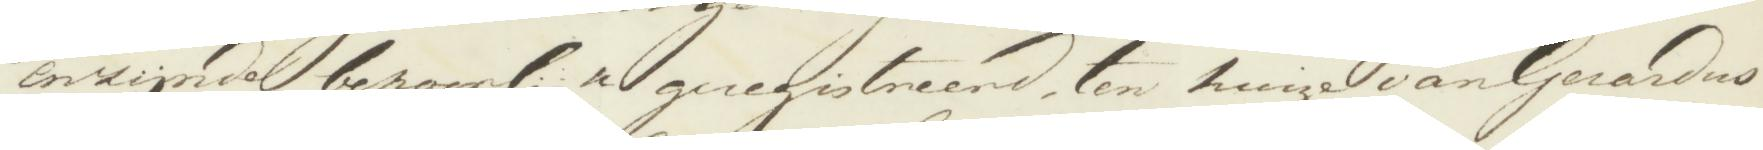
enzijnde behoorlijk geregistreerd, ten huize van Gerardus
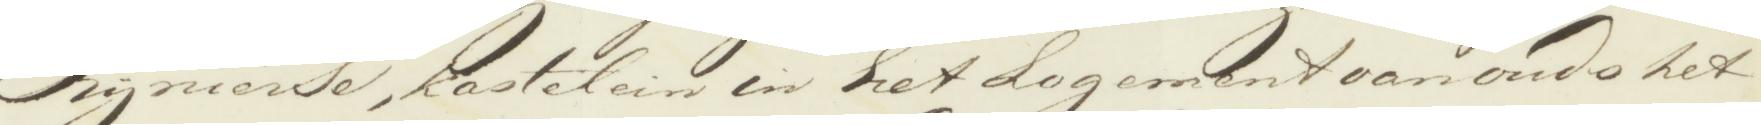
Rijnierse, kastelein in het Logement van oude het
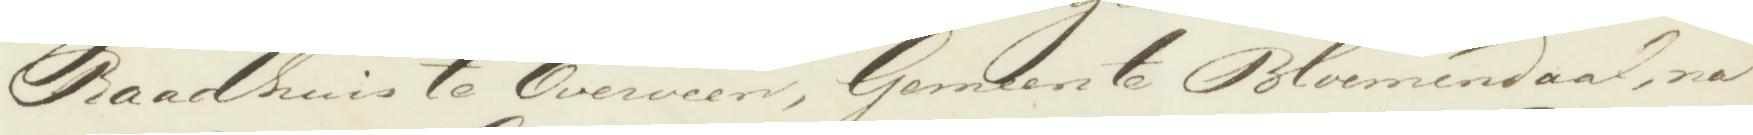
Raadhuis te Overveen, Gemeente Bloemendaal, na
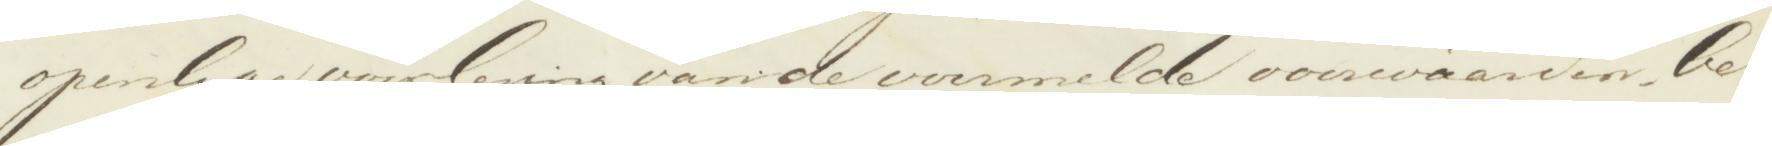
openlyke voorlezing van de voormelde voorwaarden, be
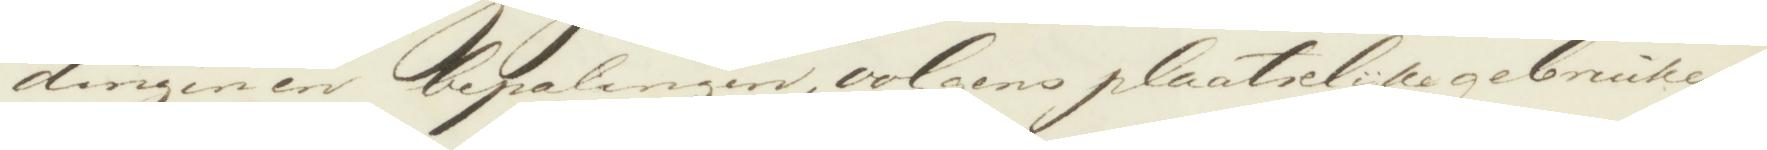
dingen en bepalingen, volgens plaatselijke gebruiken
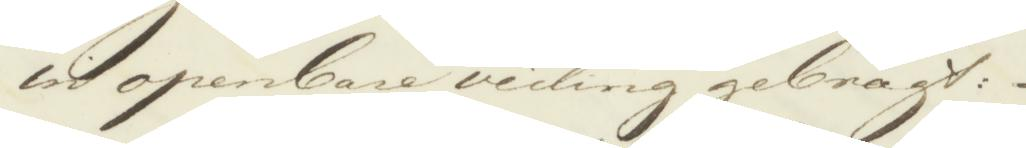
in openbare veiling gebragt: —
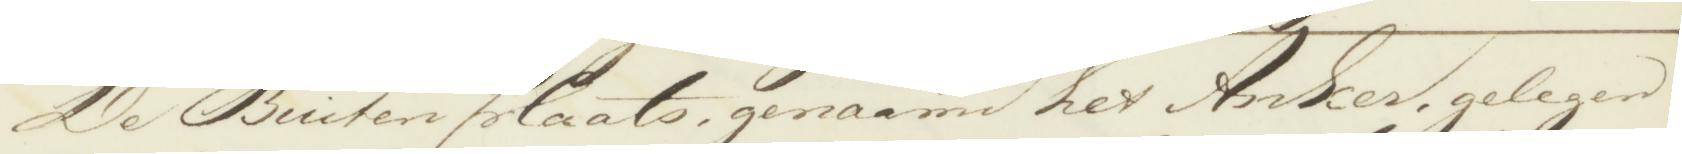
De Buitenplaats, genaamd het Anker, gelegen
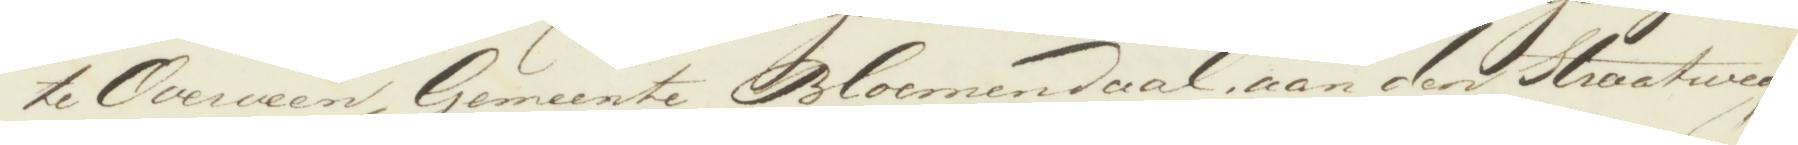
te Overveen, Gemeente Bloemendaal, aan den Straatweg
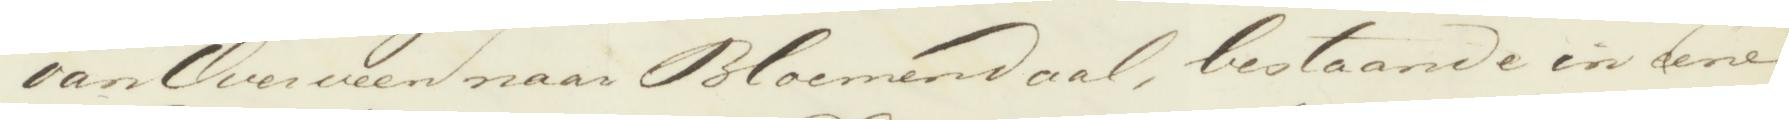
van Overveen naar Bloemendaal, bestaande in eene
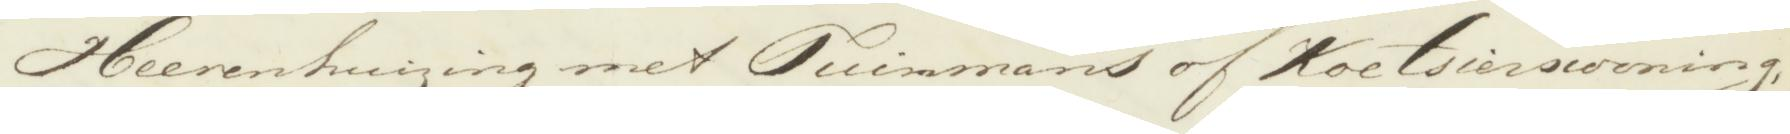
Heerenhuizing met Tuinmans of Koetsierswoning,
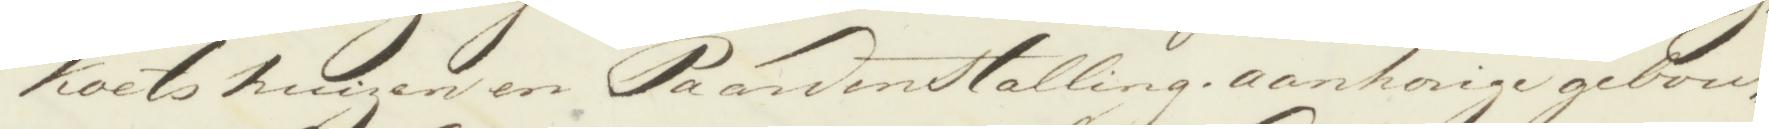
Koets huizen en Paardenstalling, aanhorige gebou„
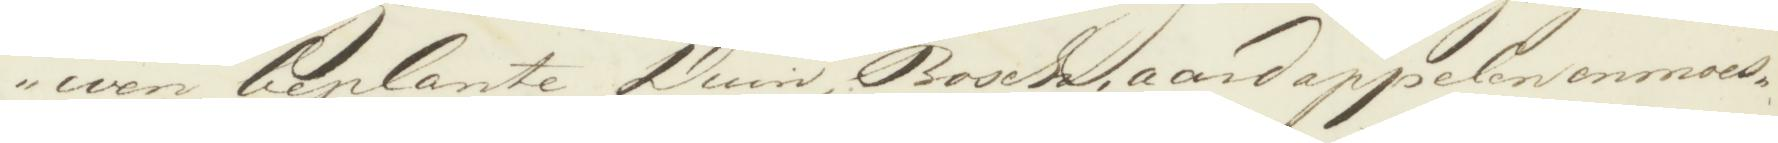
„wen, beplante Duin, Bosch, aardappelen enmoes„
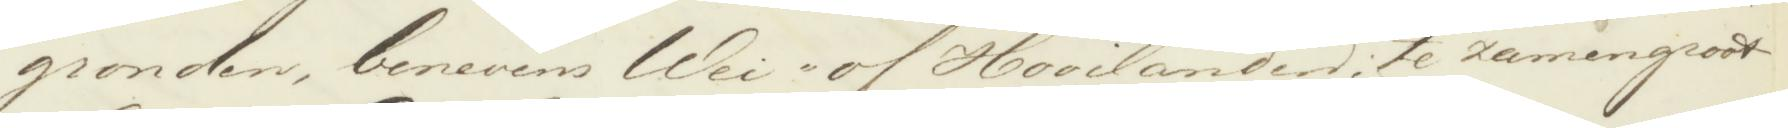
gronden, benevens Wei„ of Hooilanden; te zamen groot
